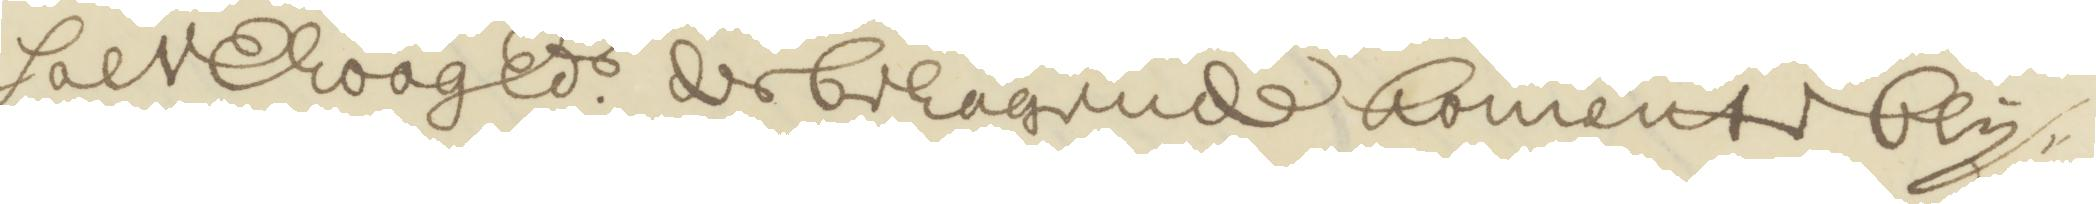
sal VE hoog Ed.s des behagende komen te blij„
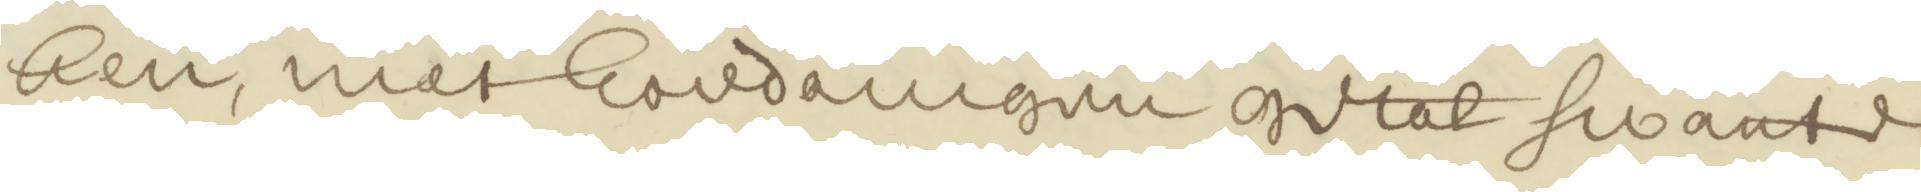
ken, met hoedanigen getal swarte
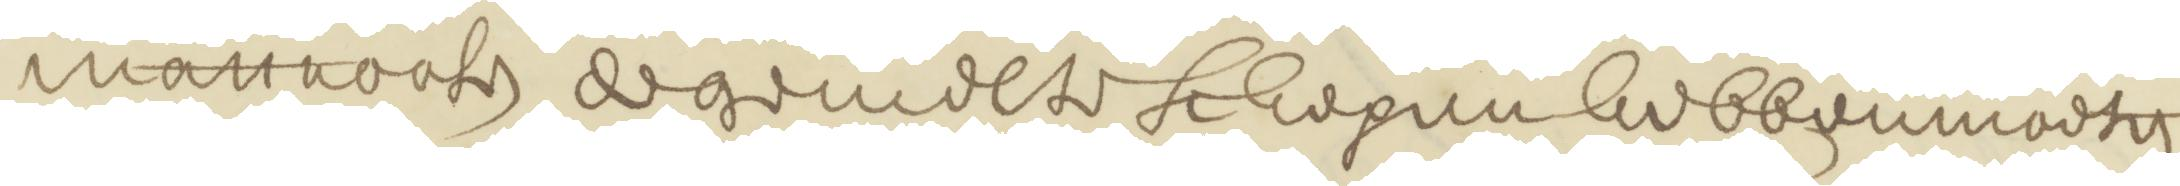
mattroosen de gemelte schepen hebben moeten
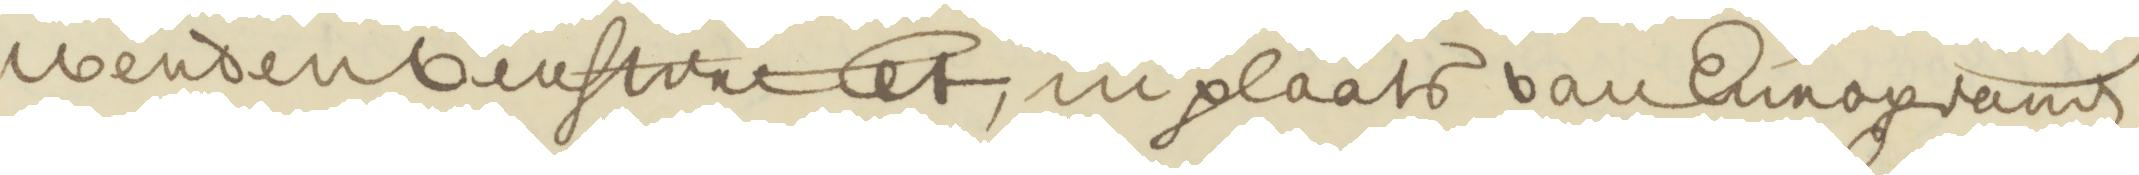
werden versterckt, in plaats van Europeanen
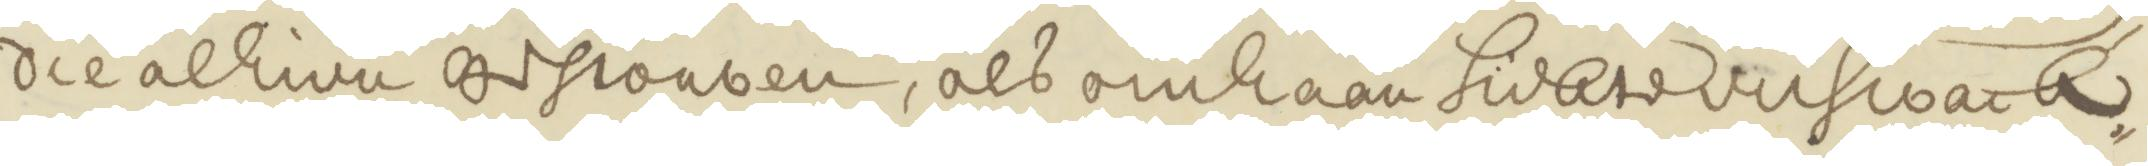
die alhier gestorven, als om haar siekte en swack„
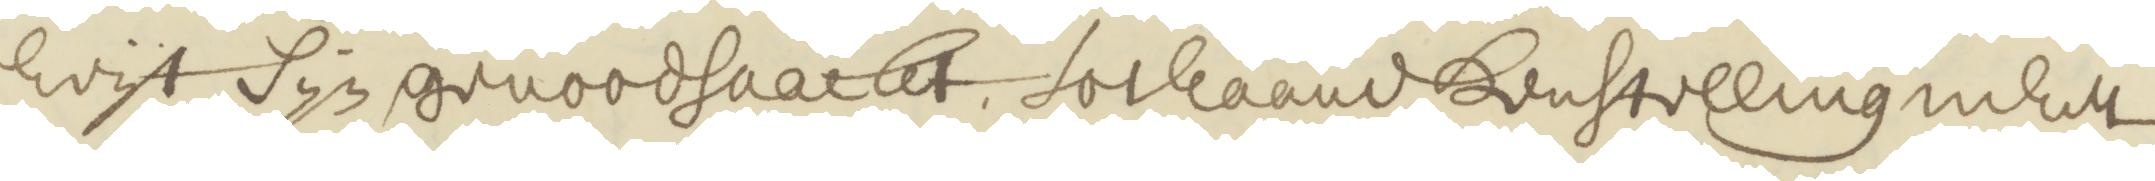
heijt sijn, genoodsaackt, tot haare Herstelling in het
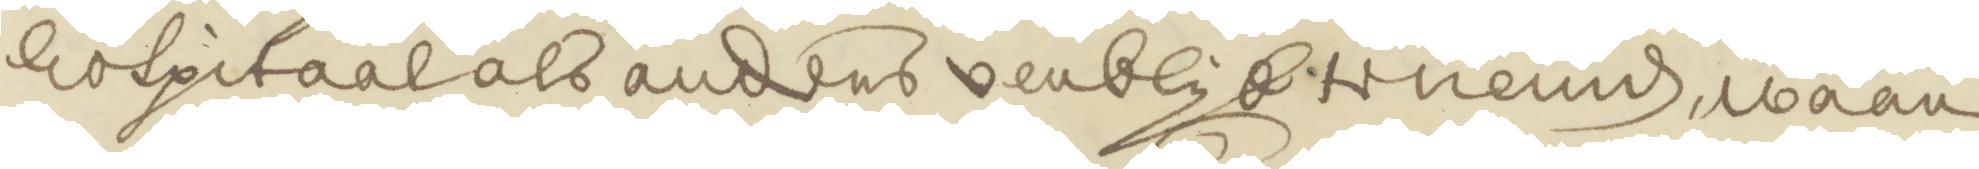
hospitaal als anders verblijf tenemen, waar
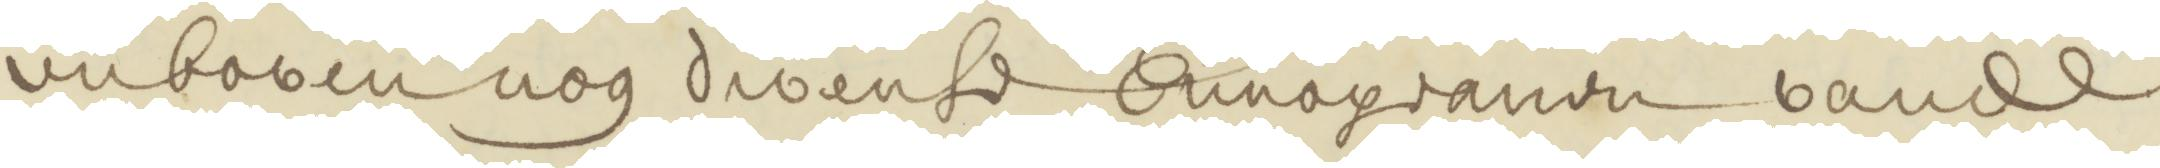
en boven nog diverse Europeanen vande
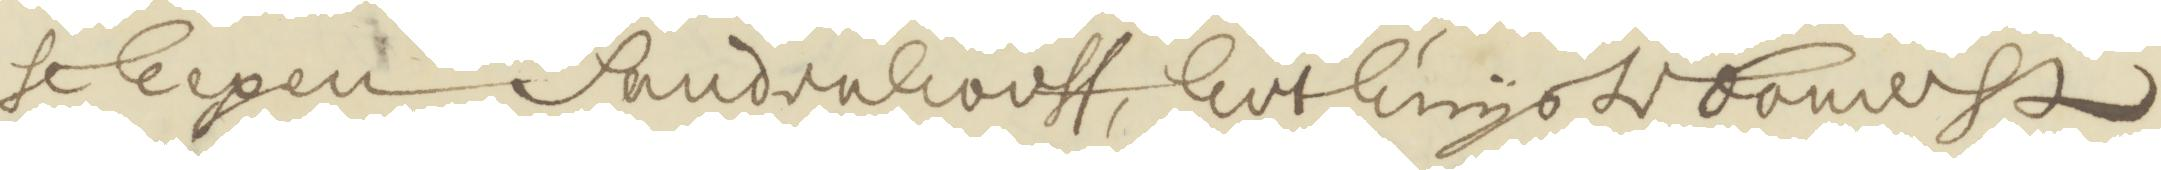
schepen sanderhoeff, het huijs te foreest,
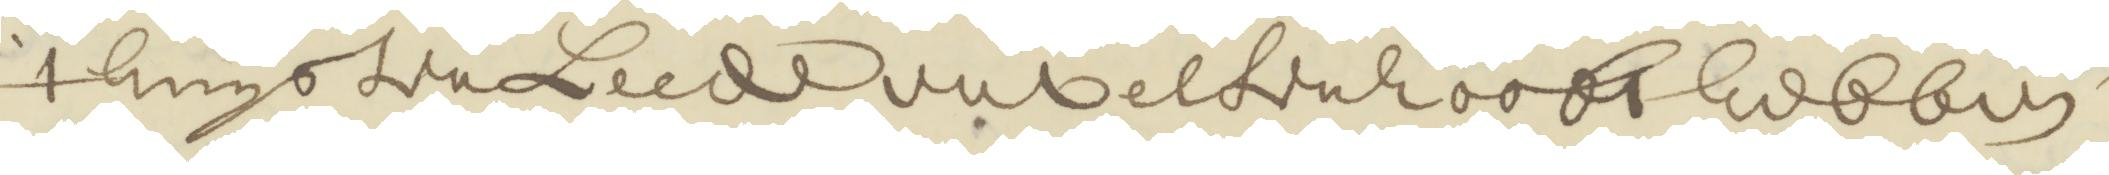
’t huijs ter Leede en Velserhooft hebben
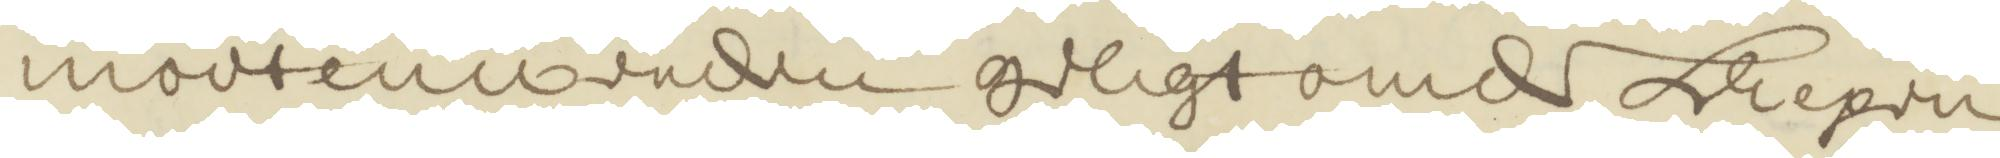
moeten werden geligt om de schepen
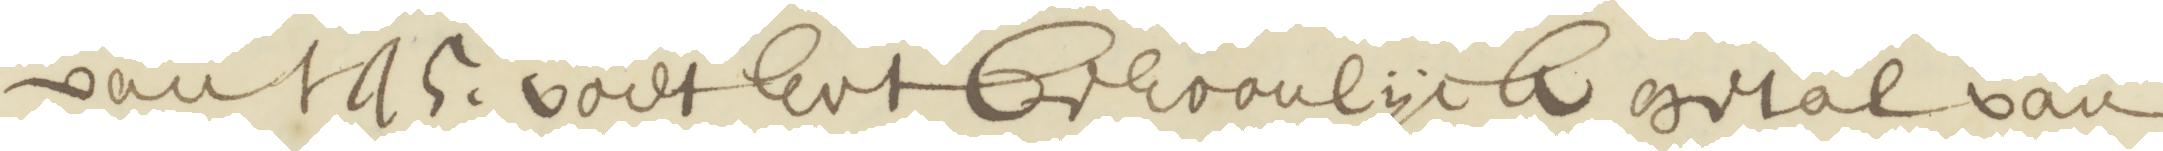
van 145. voet het behoorlijck getal van
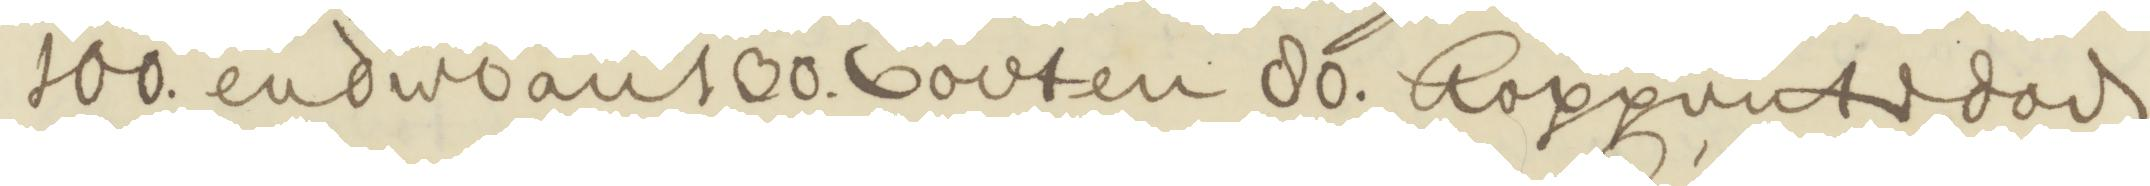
100. en die van 100. voeten 80. koppen te doen
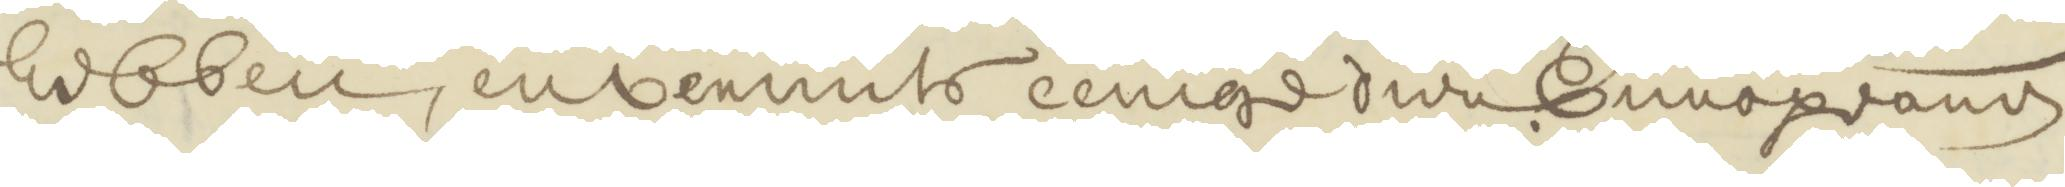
hebben, en vermits eenige dier Europeanen
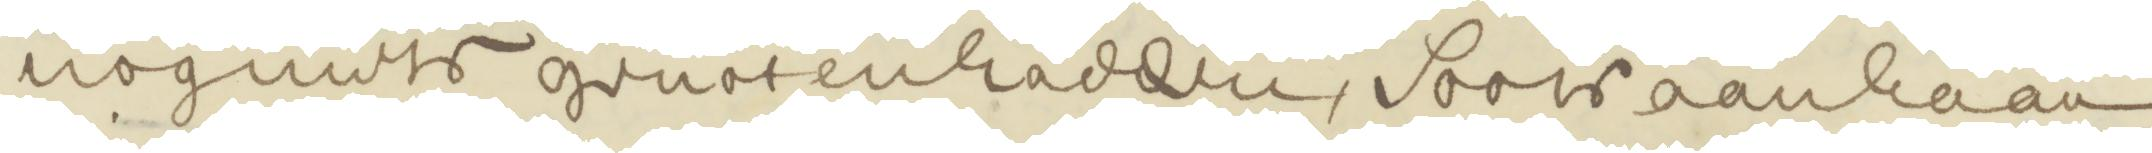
nog niets genoten hadden, soo is aan haar
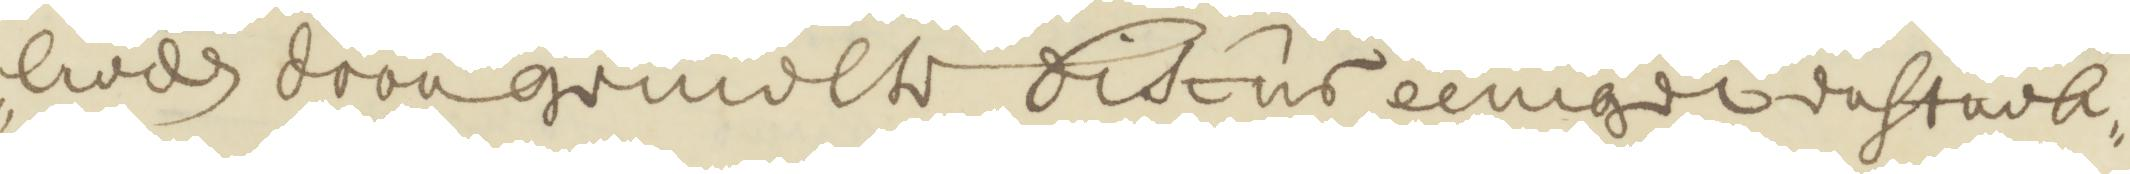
lieden door gemelte fiscus eenige verstrek„
